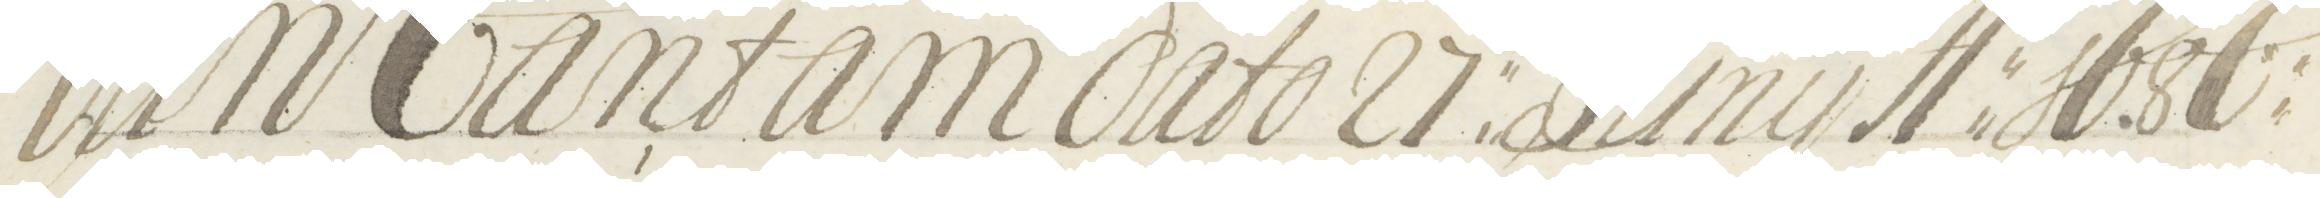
Van Bantam dato 27„“ Junij A„“ 16.86„“
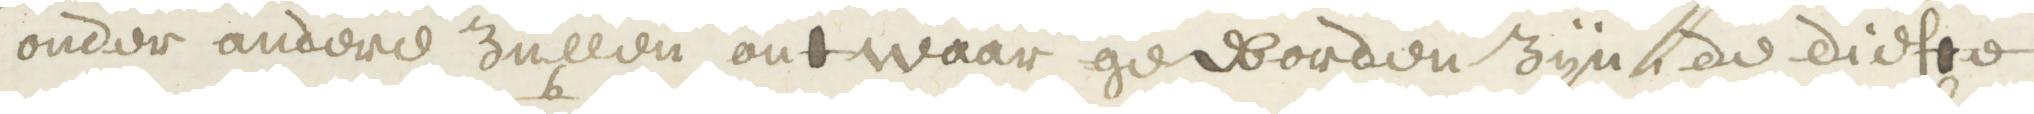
onder andere zullen ontwaar geworden zijn, de diefte
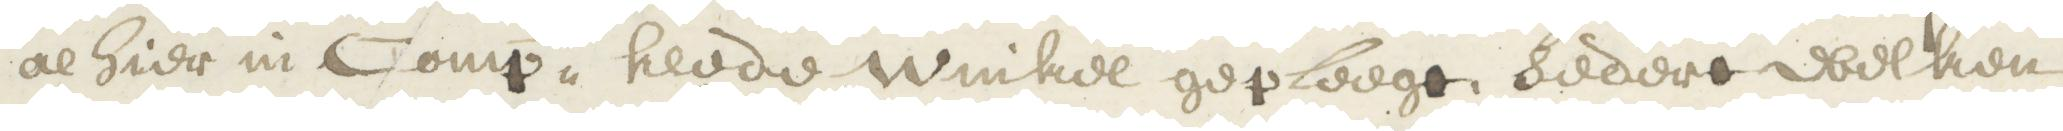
alhier in Comp„ klede winkel gepleegt sedert welken
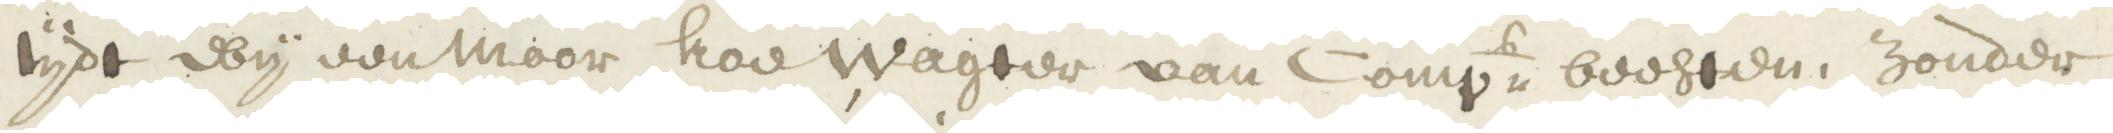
tijdt wij een moor koewagter van Comp„s beesten, zonder
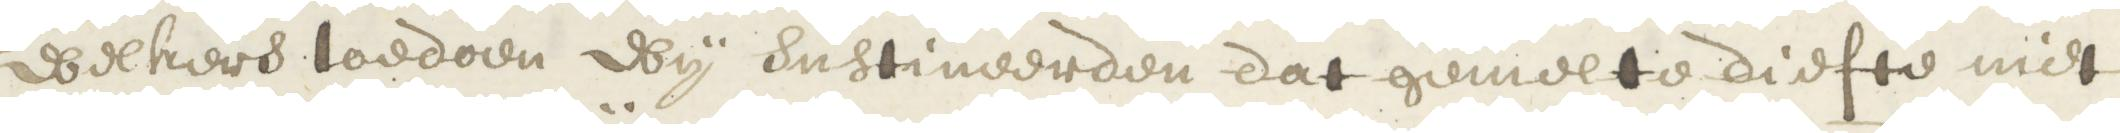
welkers toedoen wij sustineerden dat gemelte diefte niet
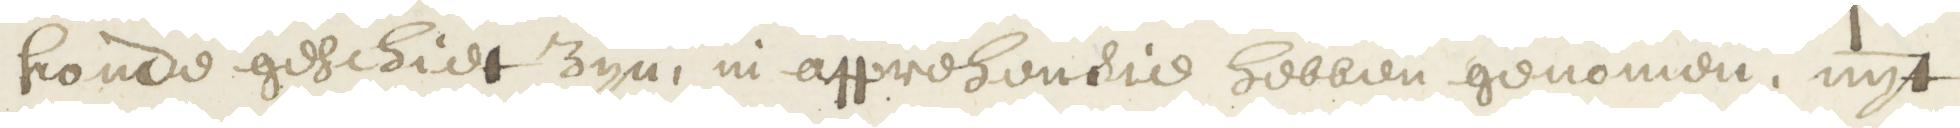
konde geschiet zijn, in apprehensie hebben genomen, uijt
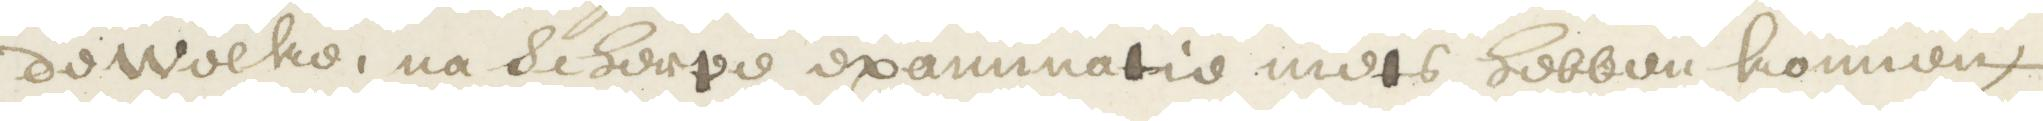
de welke, na scherpe examinatie niets hebben konnen
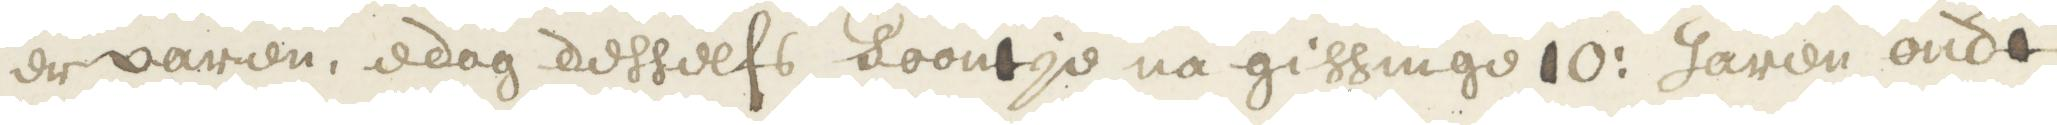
ervaren, edog desselfs soontje na gissinge 10: Jaren oudt
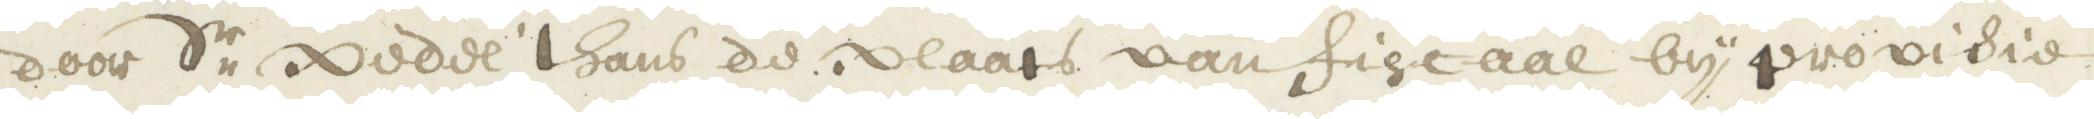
door d„r pedel 'thans de plaats van fiscaal bij provisie
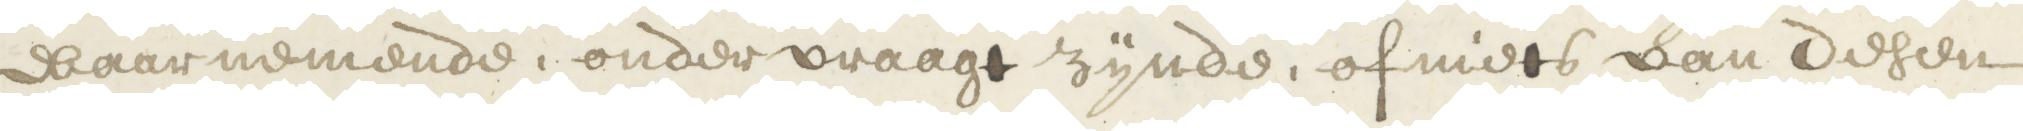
waarnemende, ondervraagt zijnde, of niets van desen
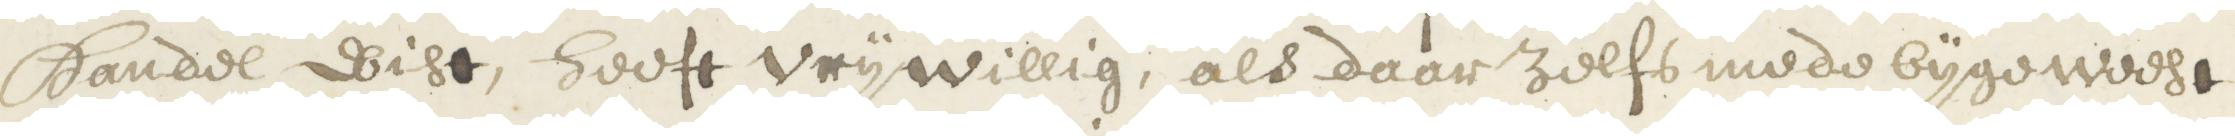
Handel wist, heeft vrijwillig, als daar zelfs mede bijgeweest
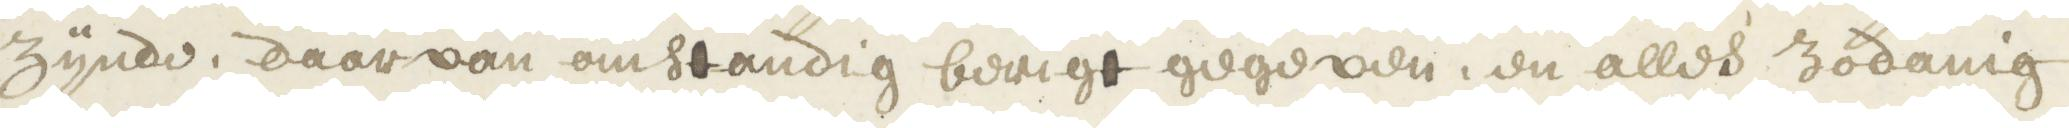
zijnde, daar van omstandig berigt gegeven, en alles' zodanig
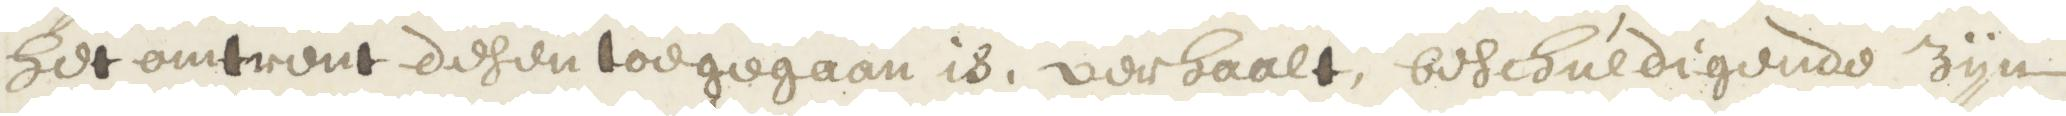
het omtrent desen toegegaan is, verhaalt, beschuldigende zijn
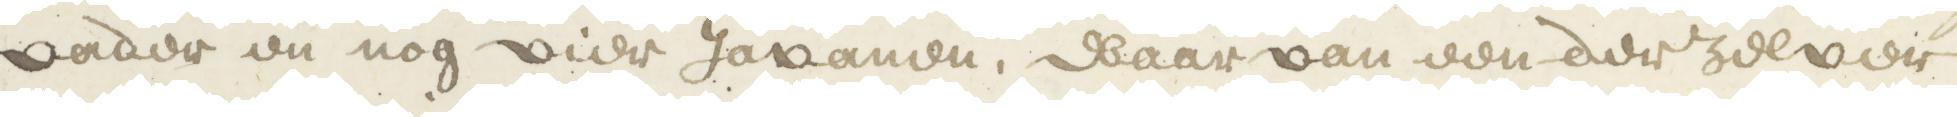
vader en nog vier Javanen, waar van een derzelver
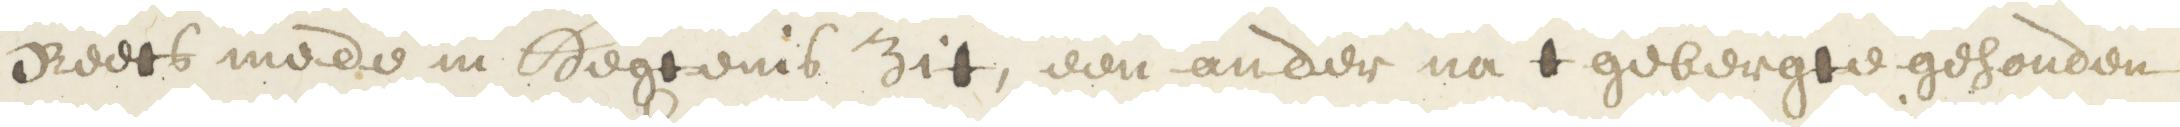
Reets mede in Hegtenis zit, een ander na t gebergte gesonden
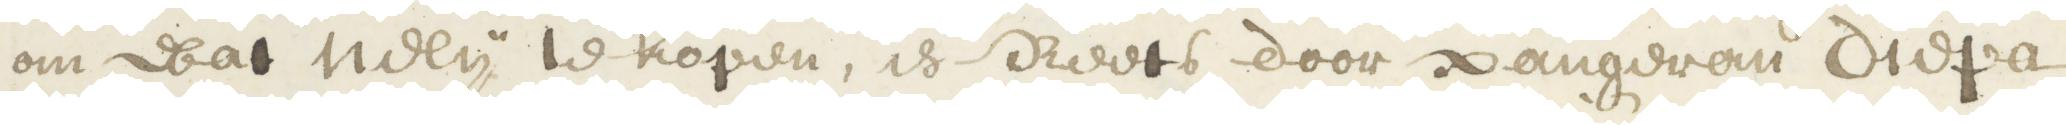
om wat nelij te kopen, is Reets door pangeran diepa
